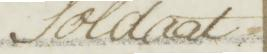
Soldaat
